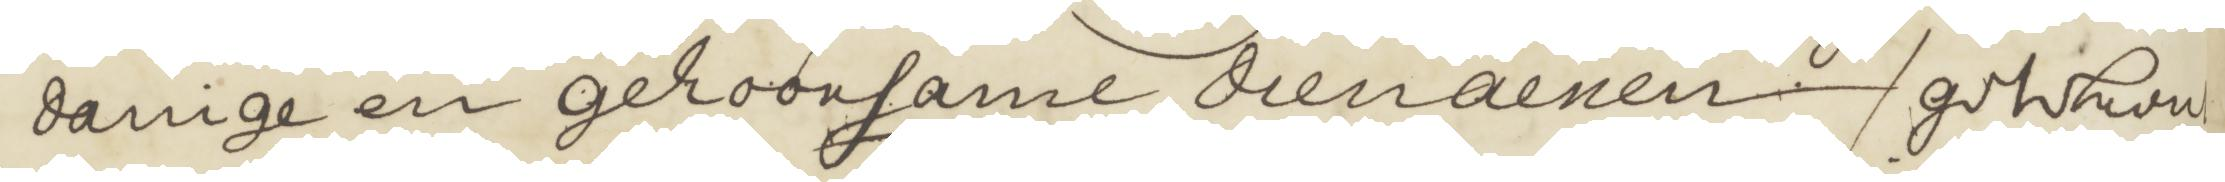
danige en gehoorsame dienaeren /getekent
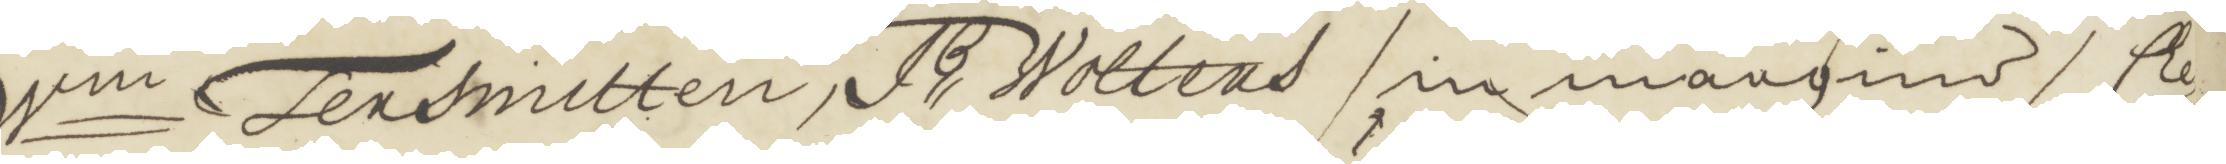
W=m Tersmitten, J„b Wolters / in margine/ Che„
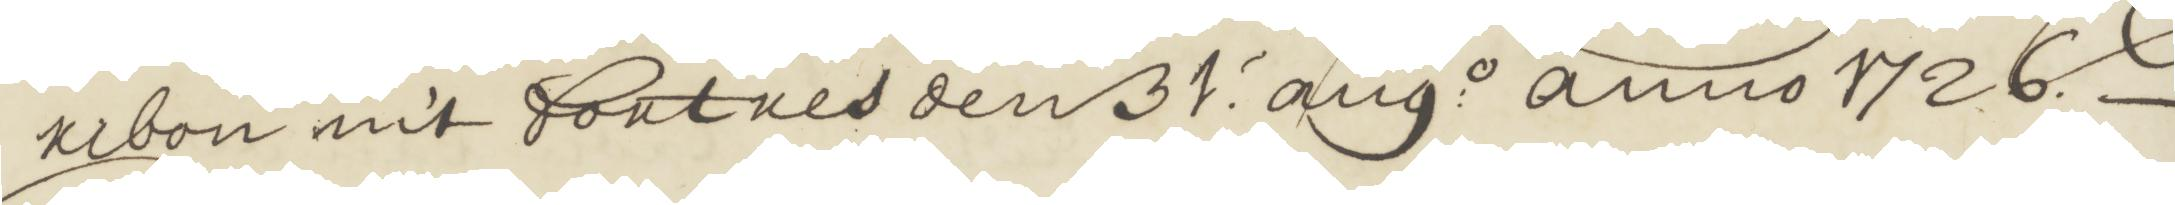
ribon in’t fortres den 31:en aug:o anno 1726. —
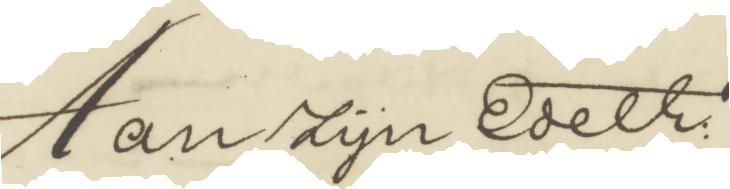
Aan zijn Edelh:t
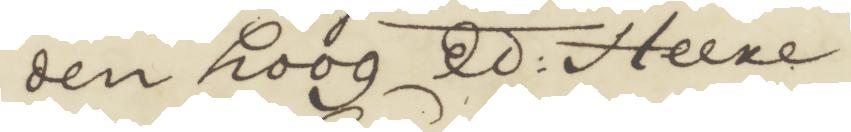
den hoog Ed: Heere
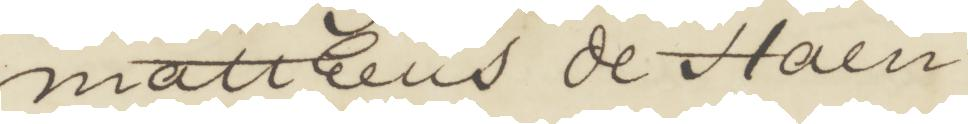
mattheus de Haen
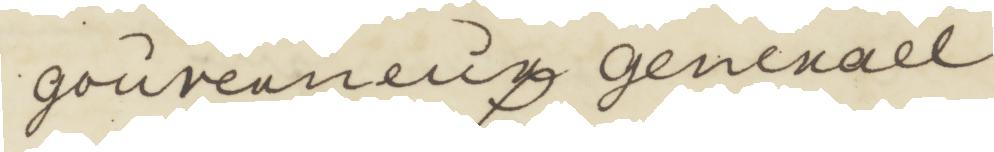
gouverneur generael
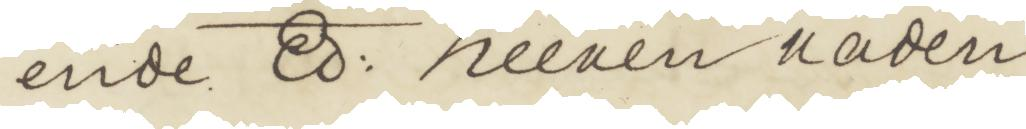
ende Ed: heeren raden
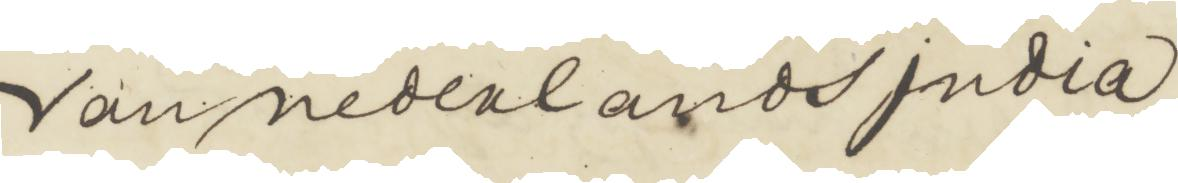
van nederlands jndia
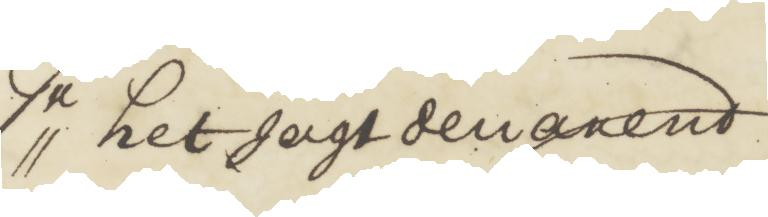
P„r het jagt den arend
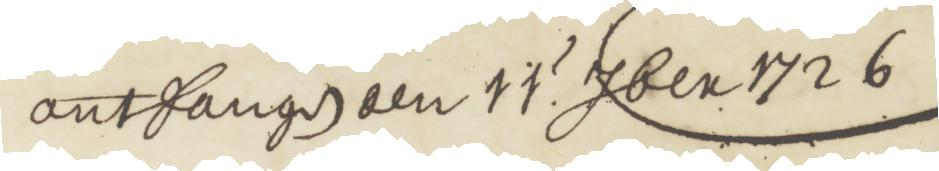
ontfangen den 11.en 7ber 1726
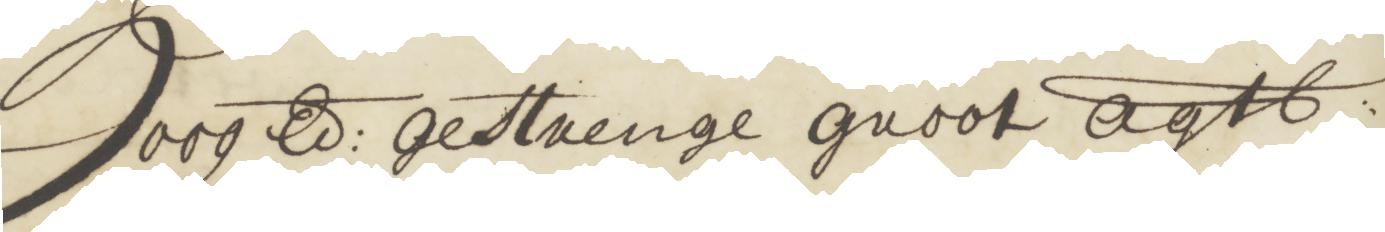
Hoog Ed: gestrenge groot agtb:
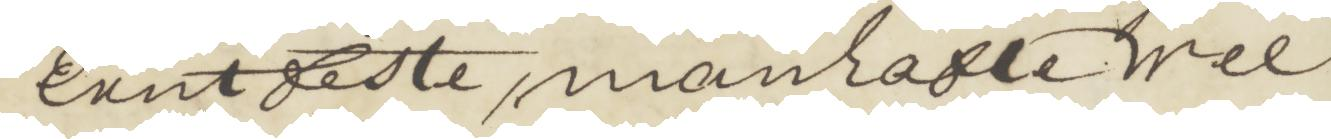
Erntfeste, manhafte wel
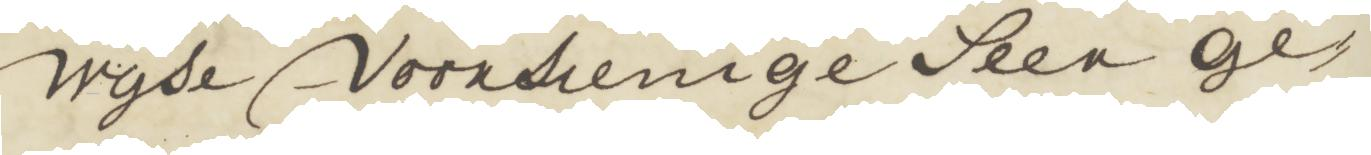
wijse voorsienige Seer ge„
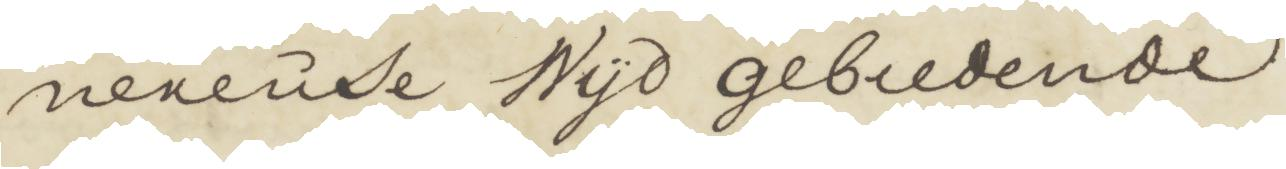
nereuse Wijd gebiedende
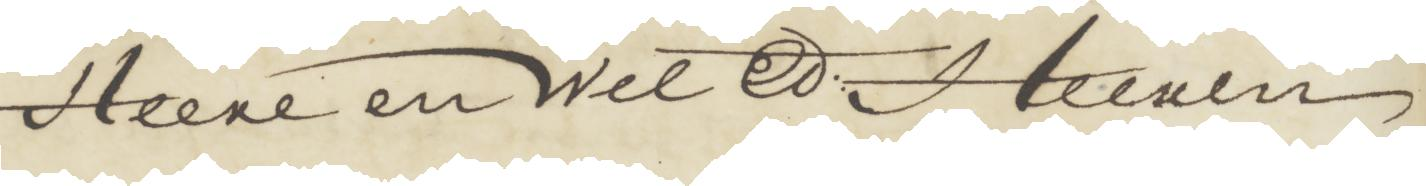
Heere en Wel Ed. Heeren
